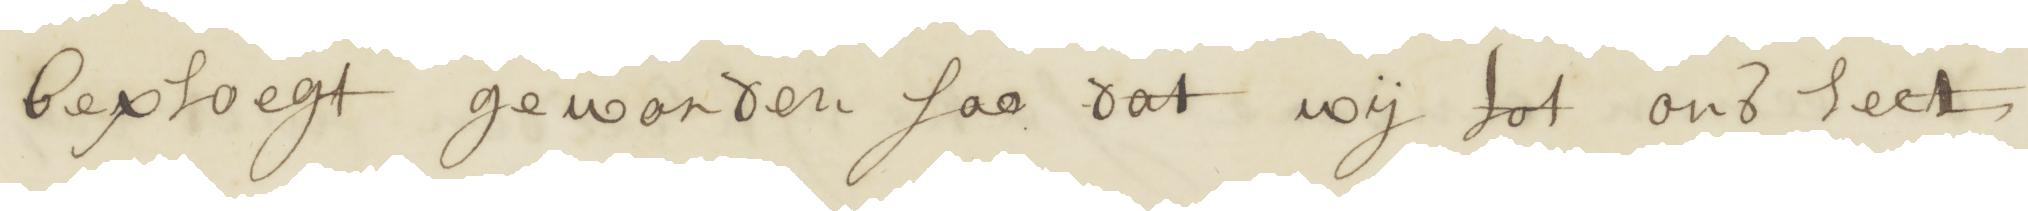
beploegt geworden soo dat wij tot ons leet
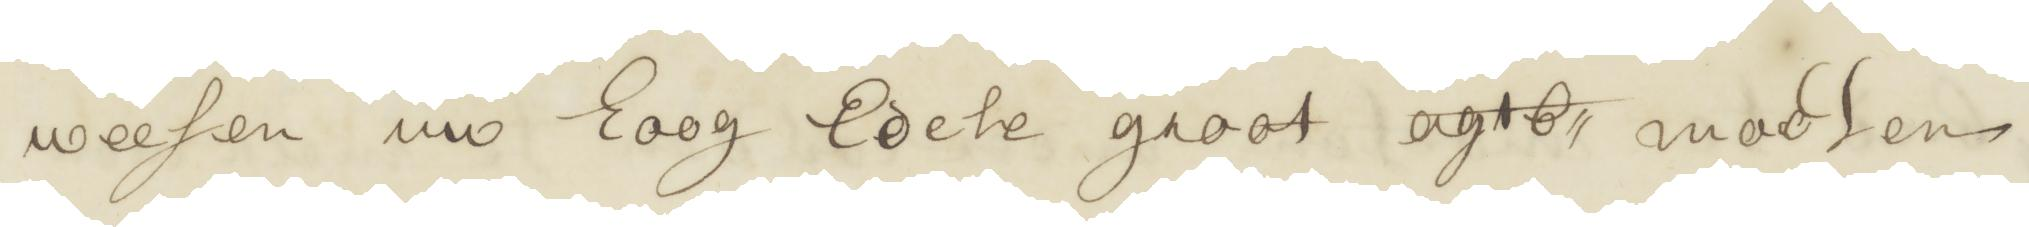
weesen uw hoog Edele groot agtb„ moeten
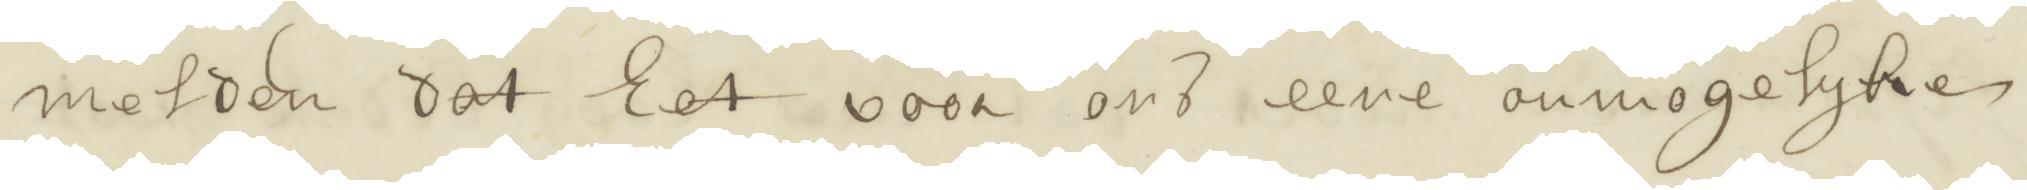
melden dat het voor ons eene onmogelyke
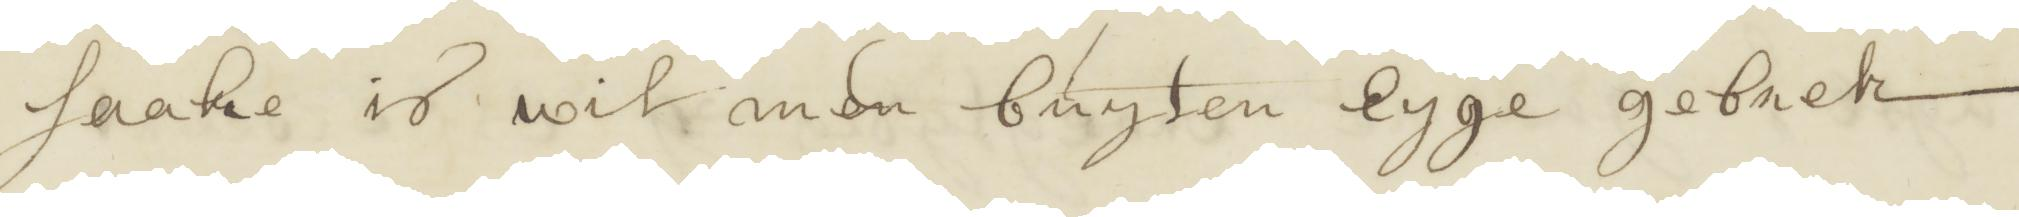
saake is wil men buijten Eyge gebrek
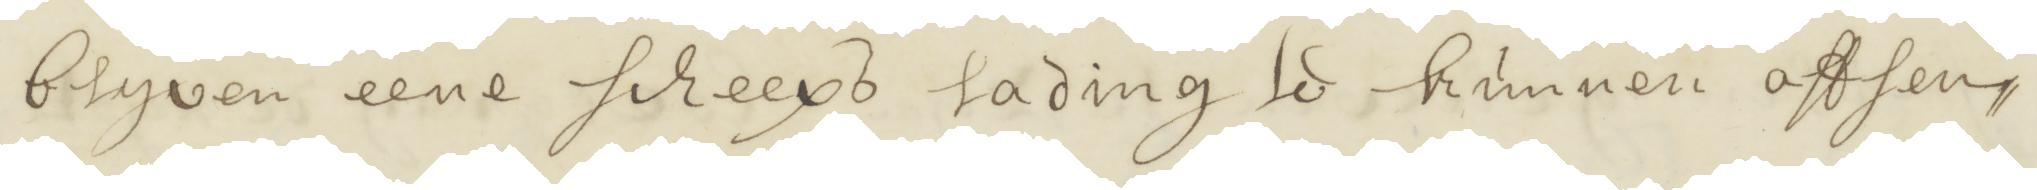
blyven eene scheeps lading te kunnen affsen„
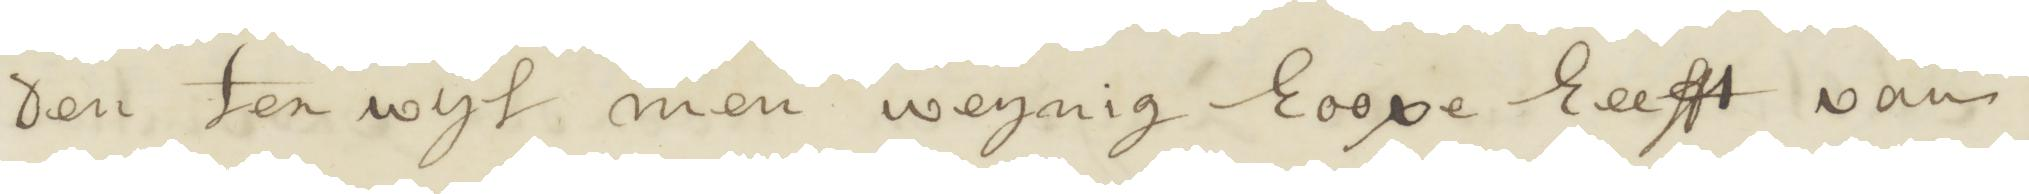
den ter wyl men weynig hoope heefft van
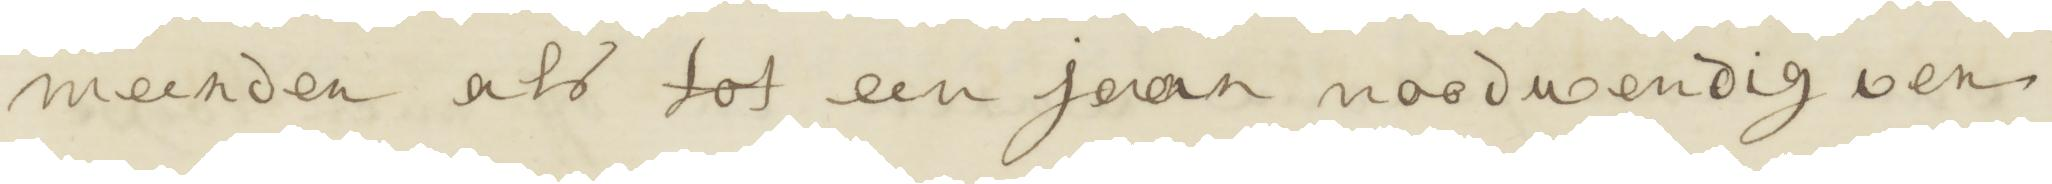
meerder als tot een jaar noodwendig ver
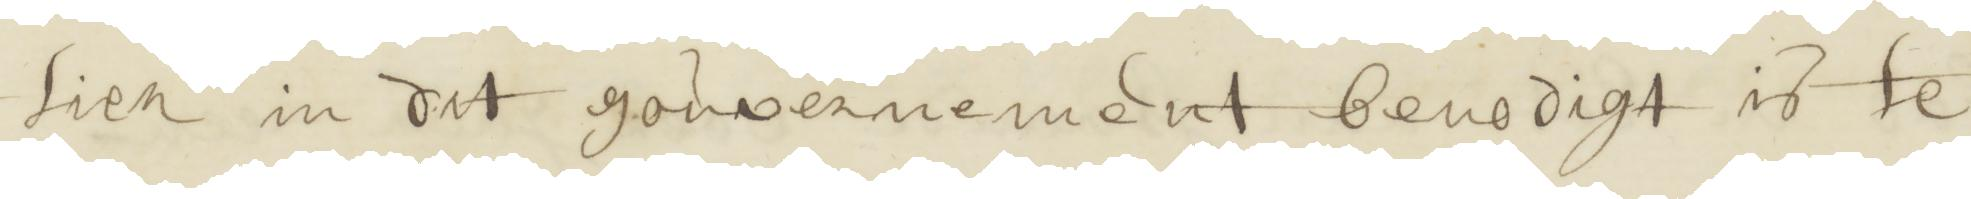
tier in dit gouvernement benodigt is te
